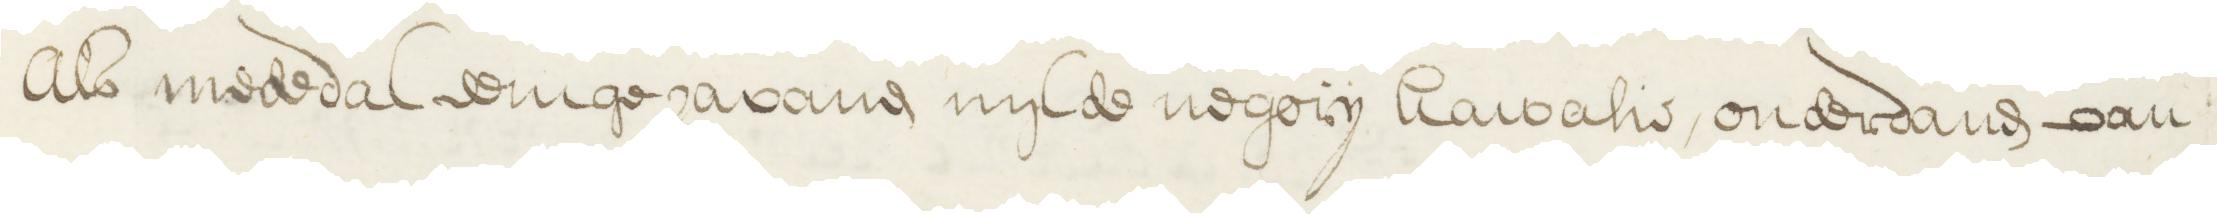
Als mede dat eenige javanen uyt de negorij kawalie, onderdanen van
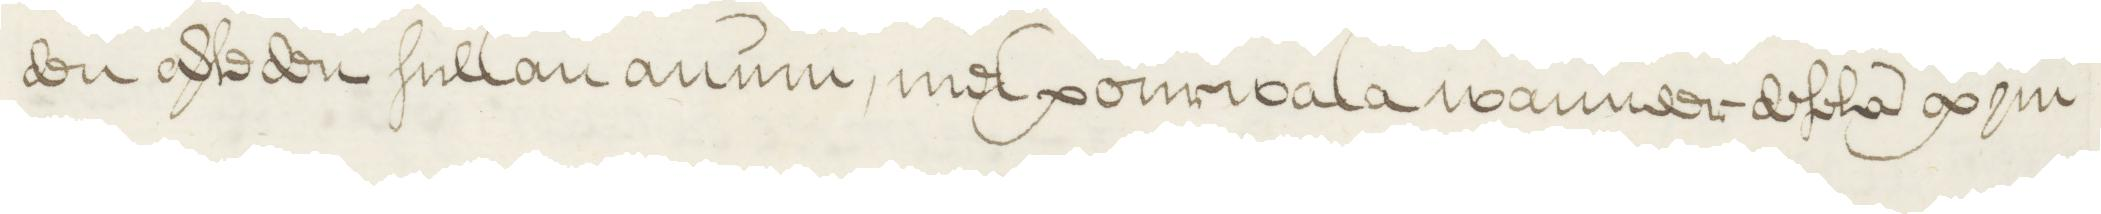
den overleden sultan anum, met pourwata wanneer deselve op jm
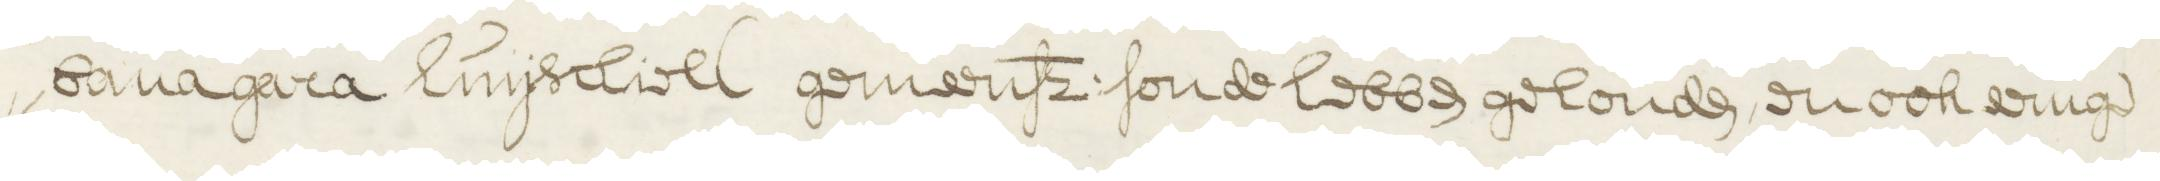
„banagara huijschielt gemeensz: soude hebben gehouden, en ook eenige
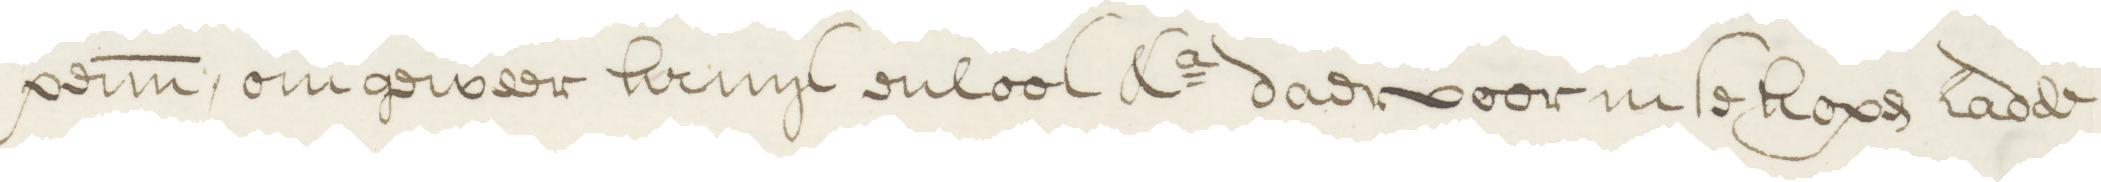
penn, om geweer kruyt enloot &=a daer voor in te kopen hadde
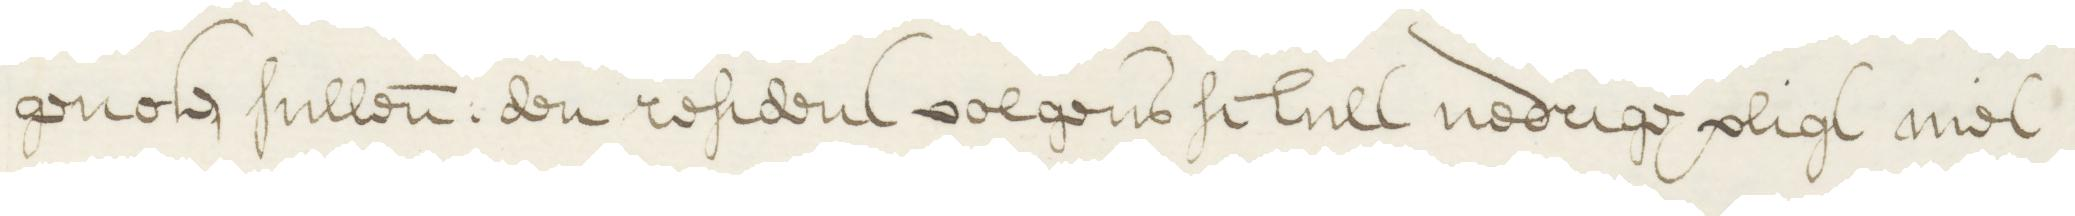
genoten sullen: den resident volgens schult nedrige pligt niet
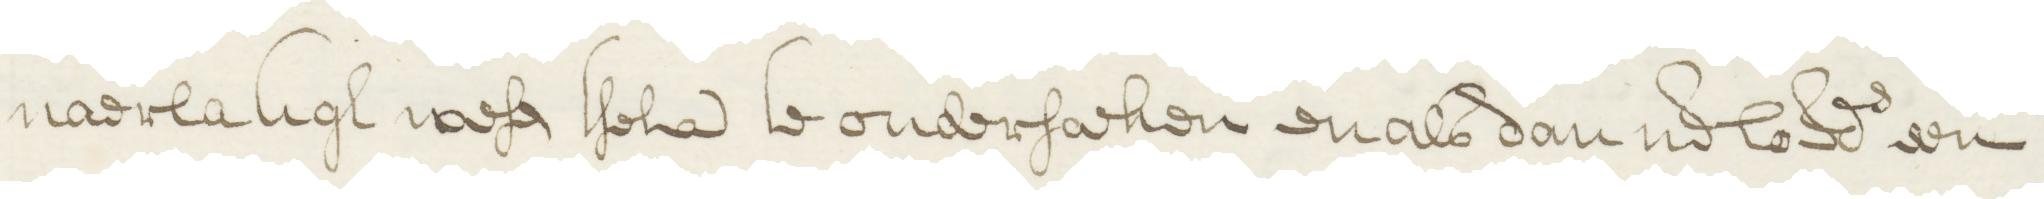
naerlatigh wesen tselve te ondersoeken en als dan uE ho Eds een
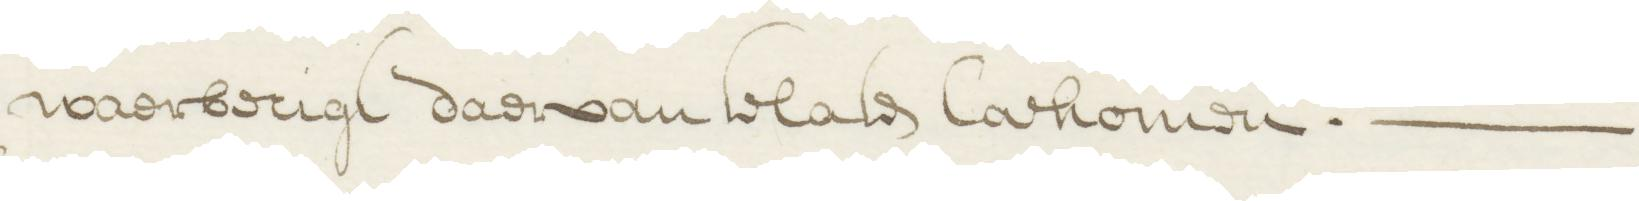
waerberigt daervan telaten toekomen. —
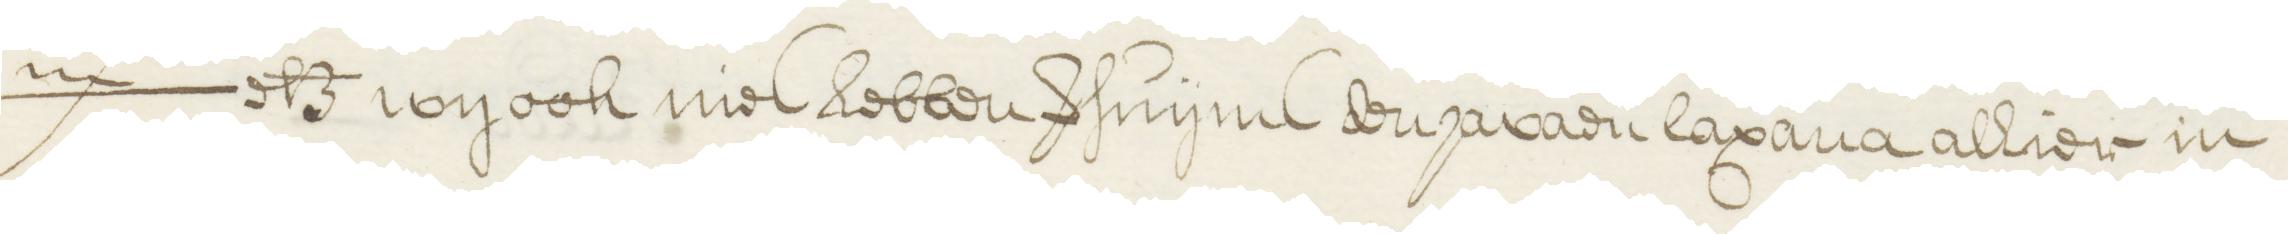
Gelyk wy ook niet hebben versuymt den javaen laxana alhier in
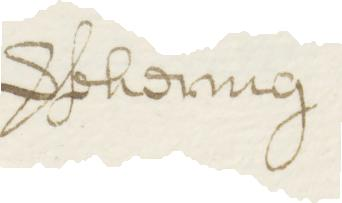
versekering
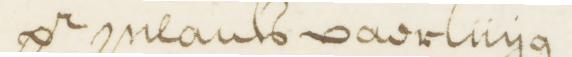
pr jnlants vaertuijg
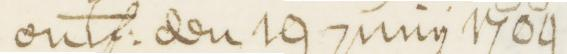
ontf: den 19 Junij 1704
